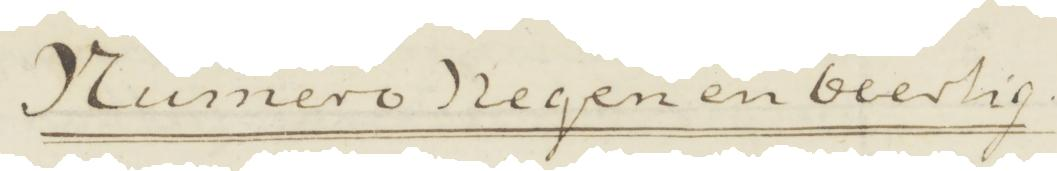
Numero Negen en veertig.
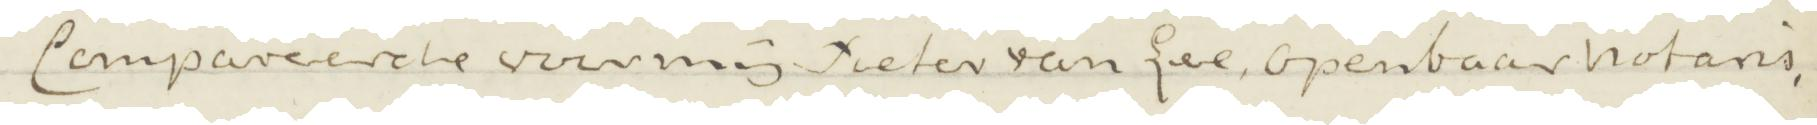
Compareerde voor mij Pieter van Lee, openbaar Notaris,
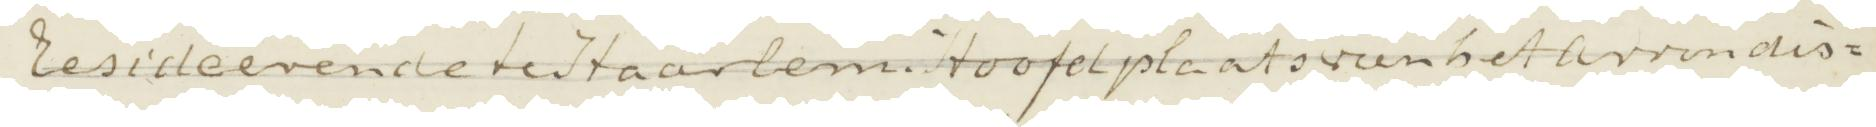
Resideerende te Haarlem Hoofdplaats van het Arrondis=
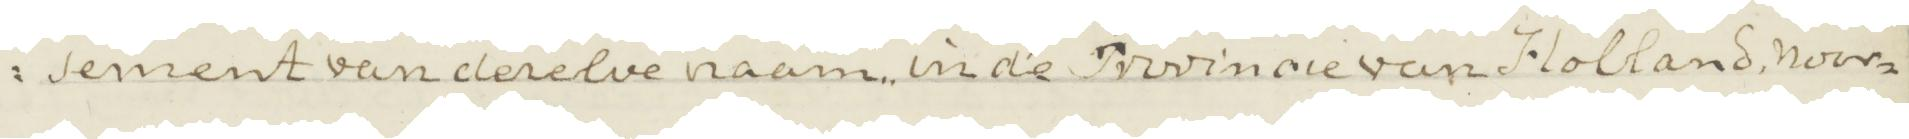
„sement van dezelve naam, in de Provincie van Holland, noor=
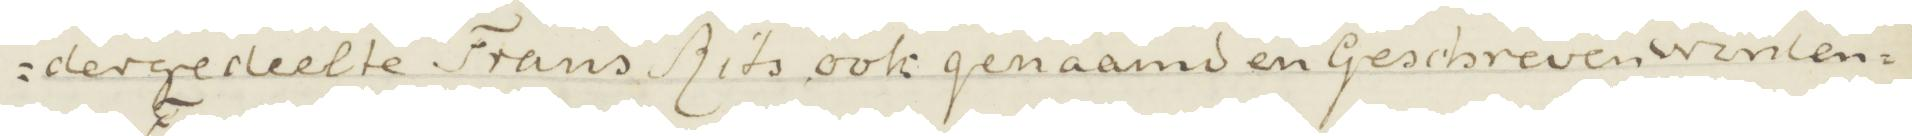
„der gedeelte Frans Rits, ook genaamd en Geschreven worden=
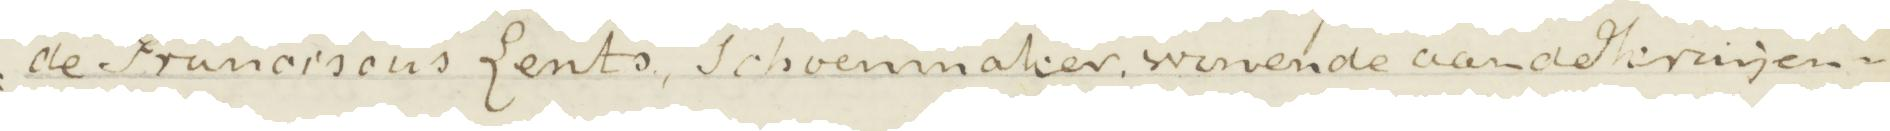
=de Franciscus Lents, Schoenmaker, wonende aan de kraijen=
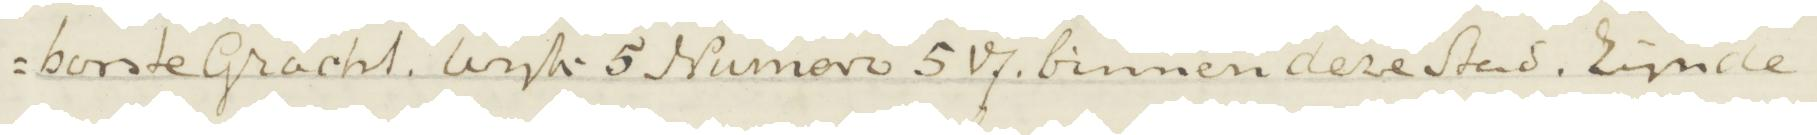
=horste Gracht, Wyk 5 Numero 517, binnen deze stad. Zijnde
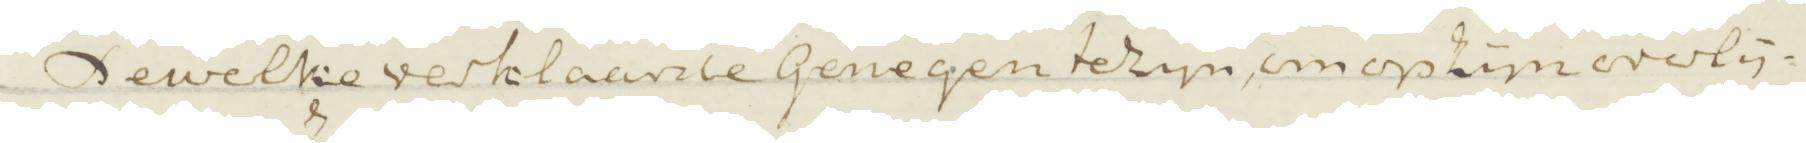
Dewelke verklaarde Genegen te Zijn, om op Zijn overlij-
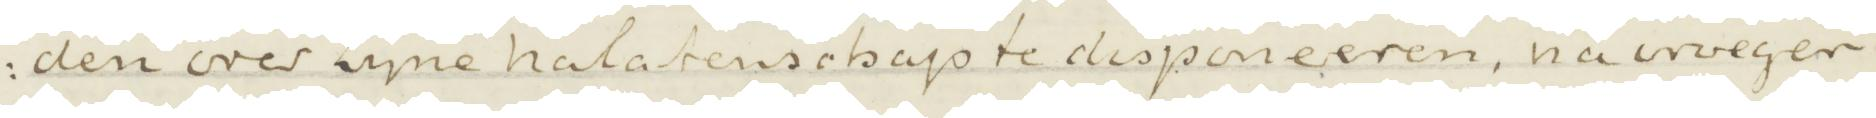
:den over Zyne nalatenschap te disponeeren, na vroeger
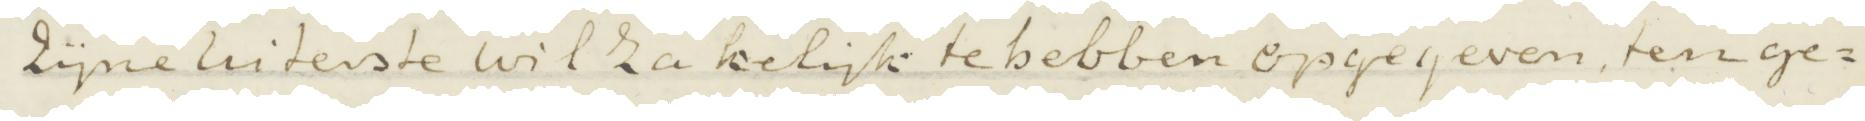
Zijne uiterste wil Zakelijk te hebben opgegeven, ten ge=
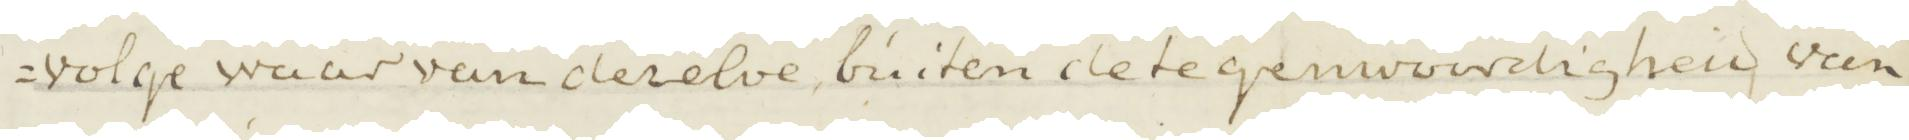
=volge waarvan dezelve, buiten de tegenwoordigheid van
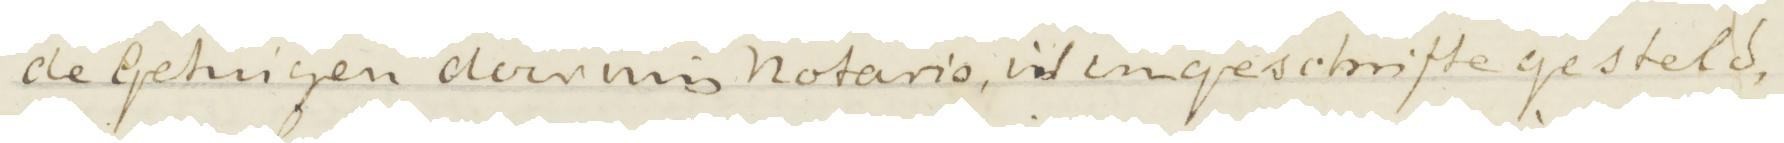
de Getuigen door mij Notaris, is in geschrifte gesteld,
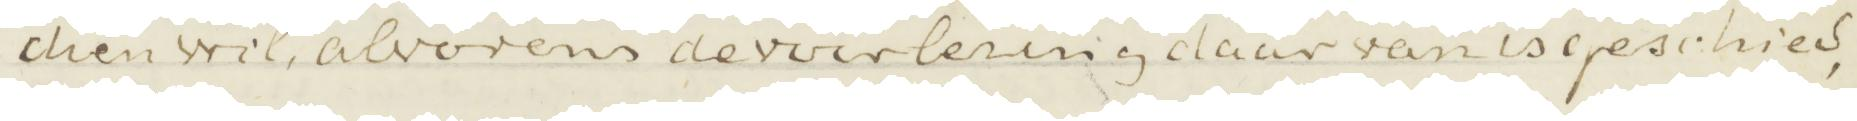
dien wil, alvorens de voorlezing daarvan is geschied,
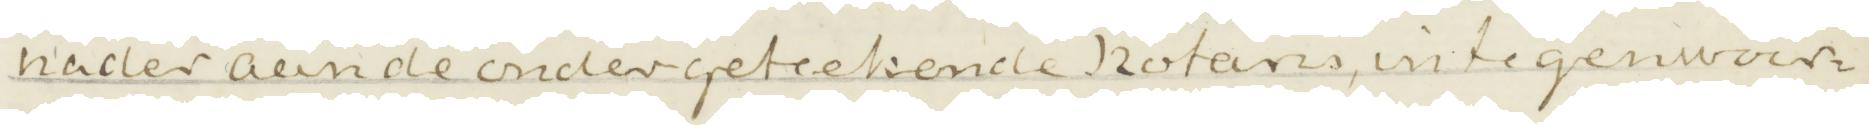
nader aan de ondergeteekende Notaris, in tegenwoor=
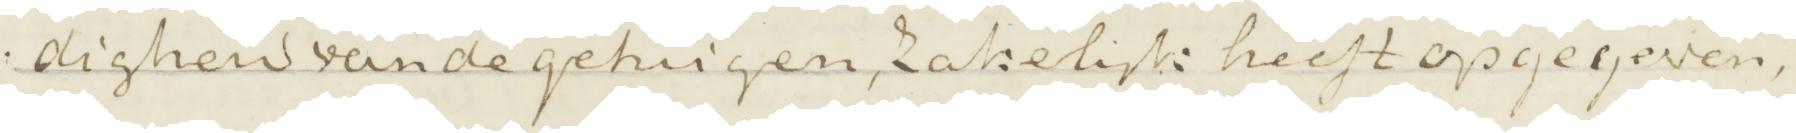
.digheid van de getuigen, Zakelijk heeft opgegeven,
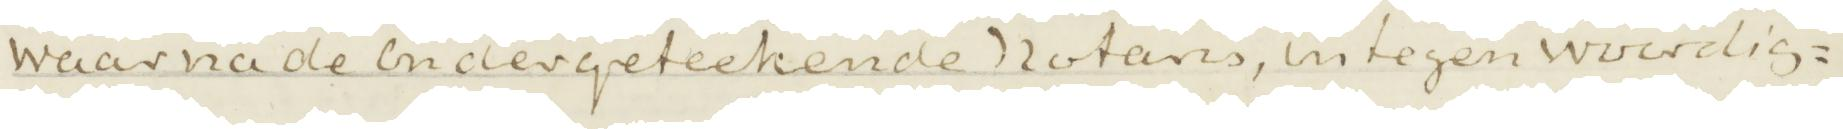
waarna de ondergeteekende Notaris, in tegenwoordig=
